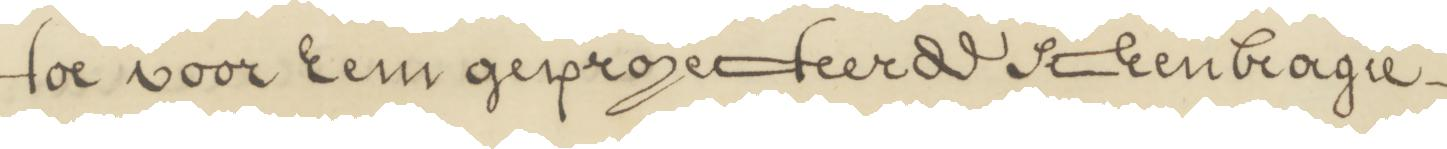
toe voor hem geprojecteerde schenkagie
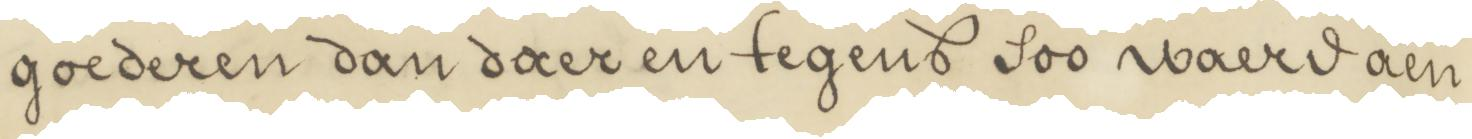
goederen dan daer en tegens soo waere aen
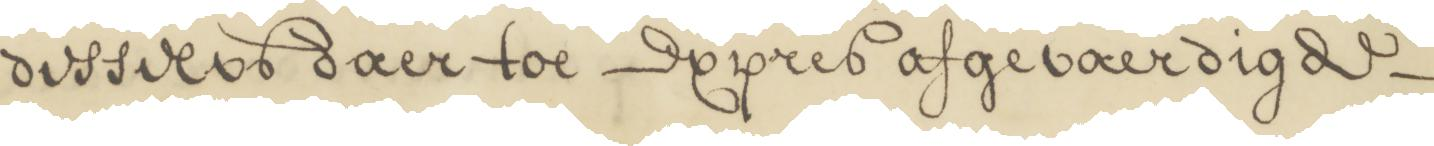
desselvs daer toe Expres afgevaerdigde
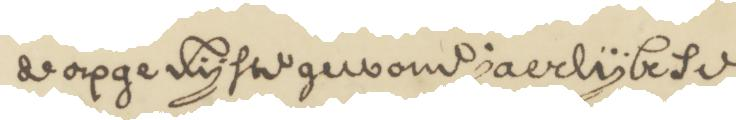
de opgeEijste gewone jaerlijkse
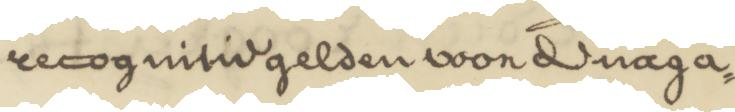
recognitie gelden voor de naga„
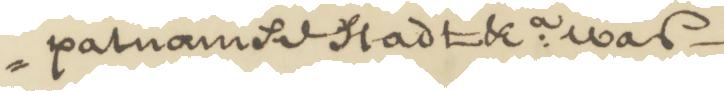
„ patnamse stadt &:a was
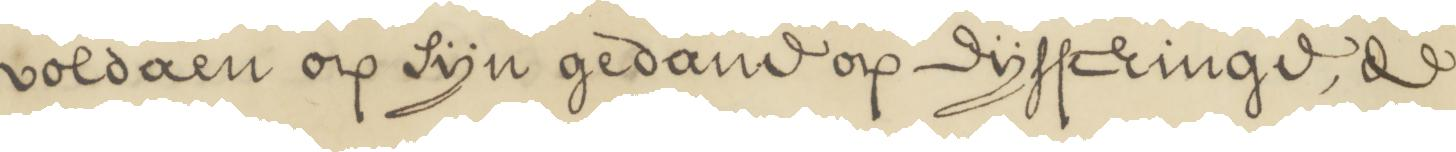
voldaen op sijn gedane op Eijsschinge, de
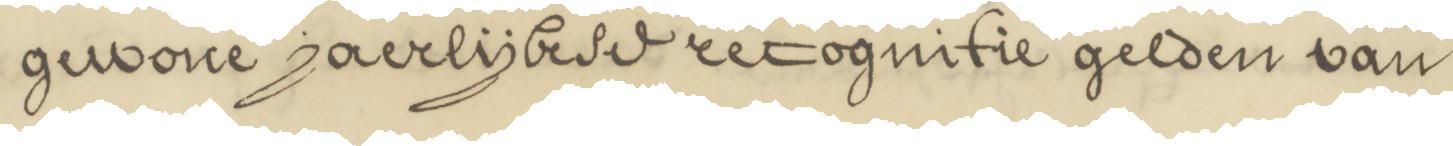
gewone jaerlijkse recognitie gelden van
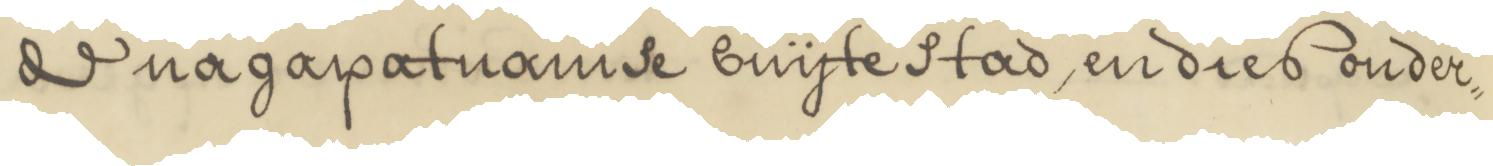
de nagapatnamse buijte stad, en dies onder„
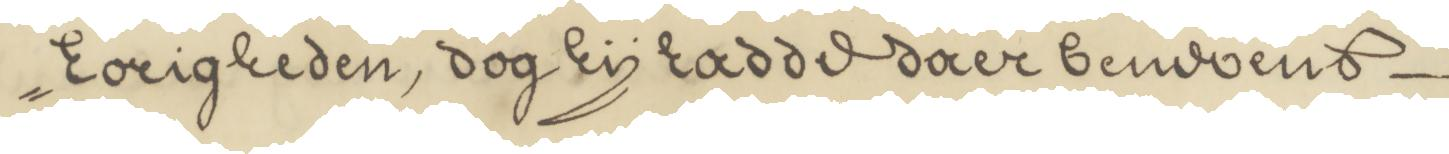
„ horigheden, dog hij hadde daer benevens
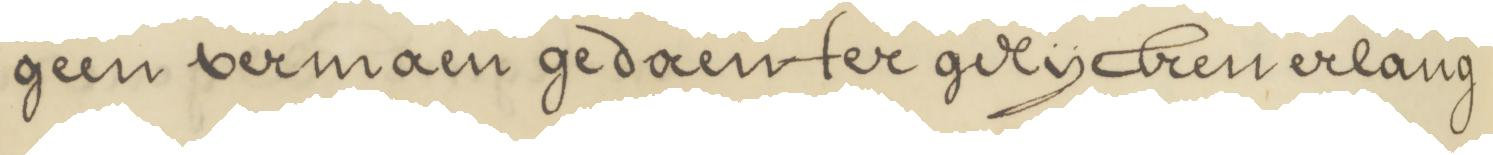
geen vermaen gedaen ter gelijcken erlang
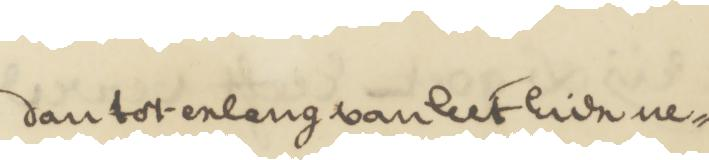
dan tot-erlang van het hier ne„
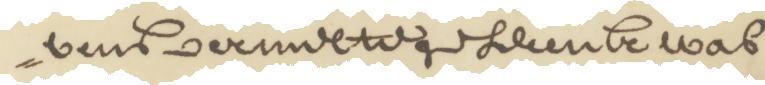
„vens vermelte geschenk was
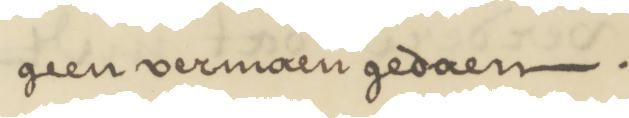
geen vermaen gedaen.
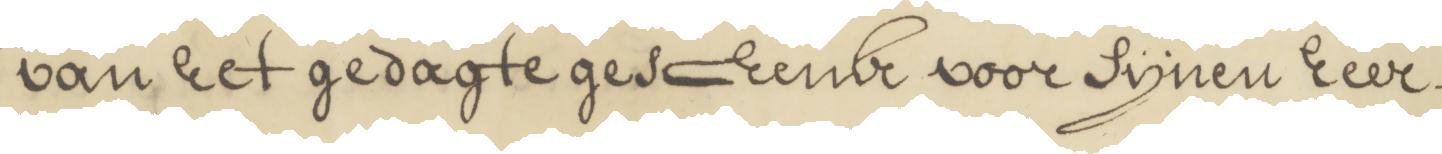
van het gedagte geschenk voor sijnen heer
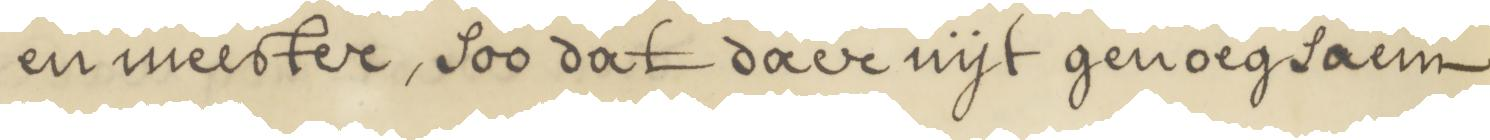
en meester, soo dat daer uijt genoegsaem
